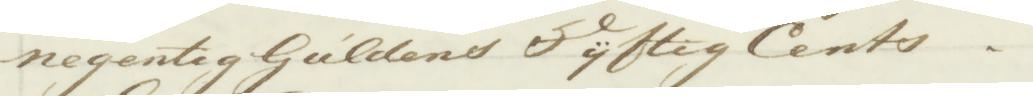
negentig Guldens Vijftig Cents -
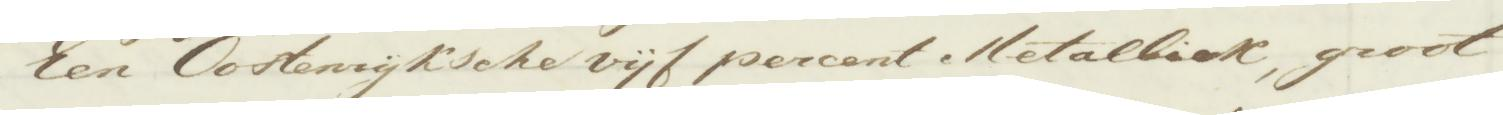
Een Oostenrijksche vijf percent Metalliek, groot
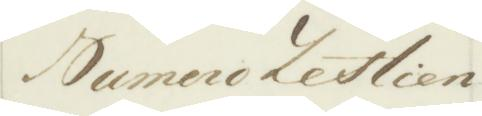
Numero Zestien
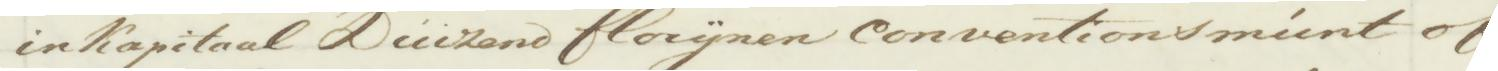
in Kapitaal Duizend florijnen conventionsmunt of
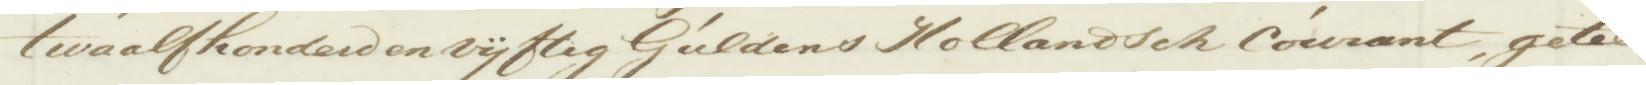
twaalf honderd en vijftig Guldens Hollandsch courant, getee
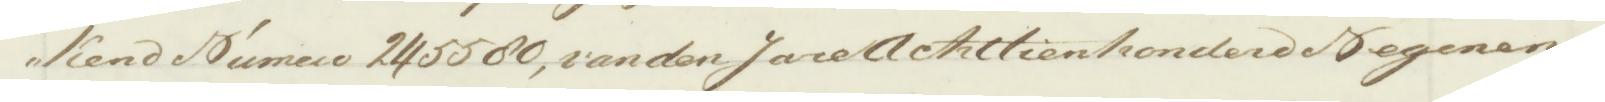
„kend Numero 245580, van den Jare Achttienhonderd Negenen.
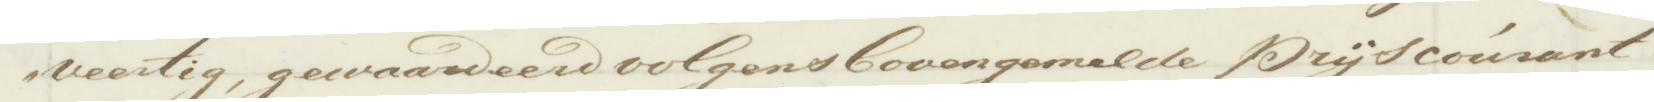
„veertig, gewaardeerd volgens bovengemelde Prijscourant
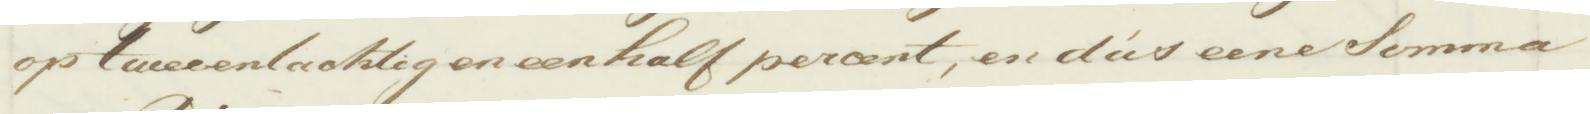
op twee en tachtig en een half percent, en dus eene somma
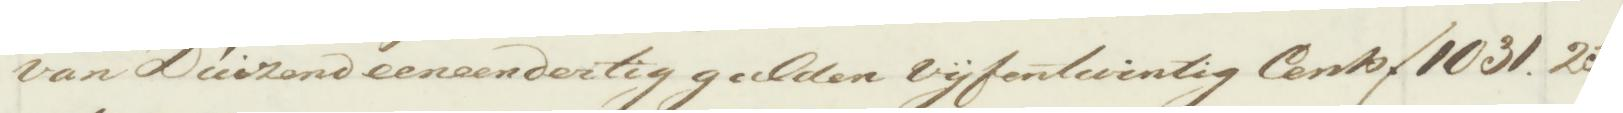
van Duizend eeneendertig gulden vijfentwintig Cents ƒ1031. 25
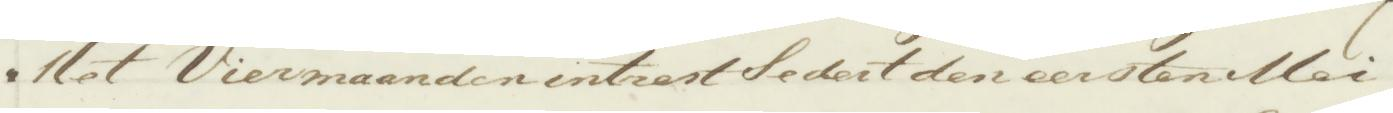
Met Vier maanden intrest sedert den eersten Mei
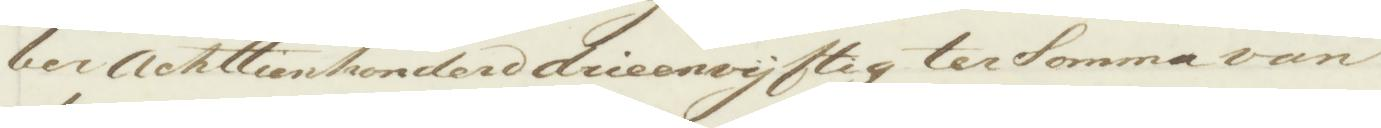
ber Achttienhonderd drieenvijftig ter somma van
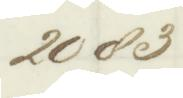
20 83
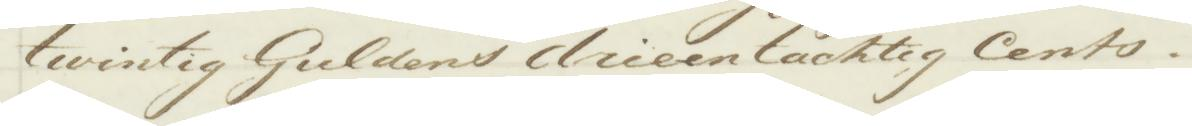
twintig Guldens drie en tachtig Cents .
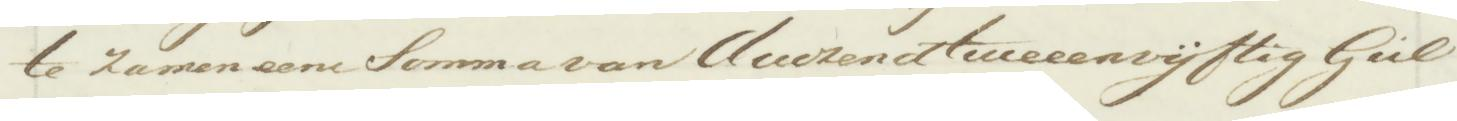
te zamen eene somma van duizend tweeenvijftig Gul
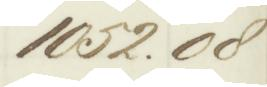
1052.08
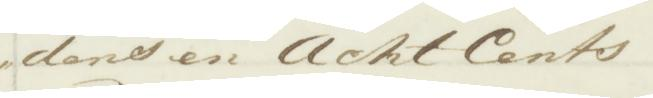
„dens en Acht Cents
